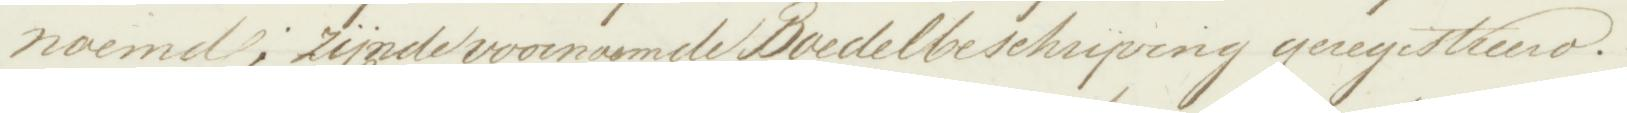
noemd; zijnde voornoemde Boedelbeschrijving geregistreerd.
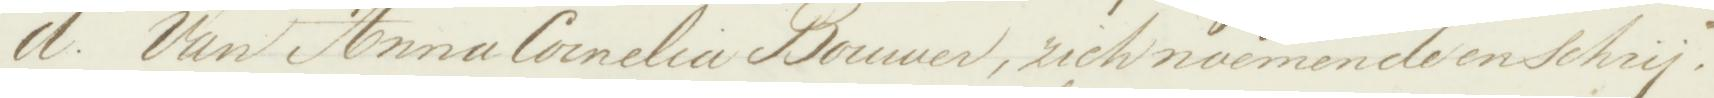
d. Van Anna Cornelia Bouwer, zich noemende en schrij„
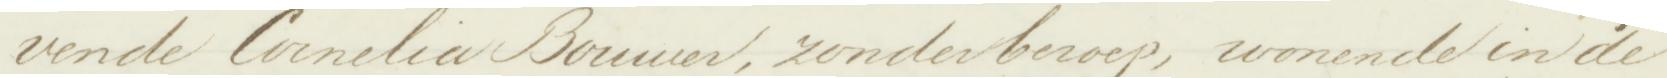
vende Cornelia Bouwer, zonder beroep, wonende in de
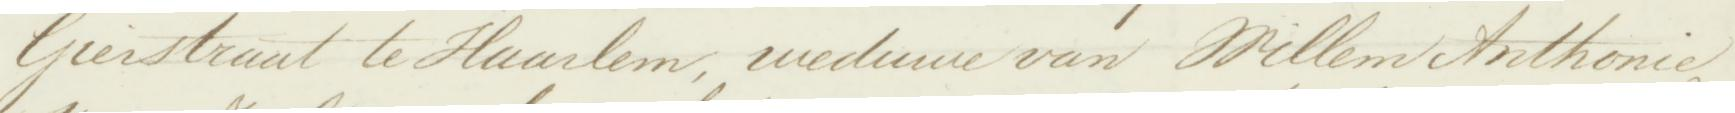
Gierstraat te Haarlem, weduwe van Willem Anthonie
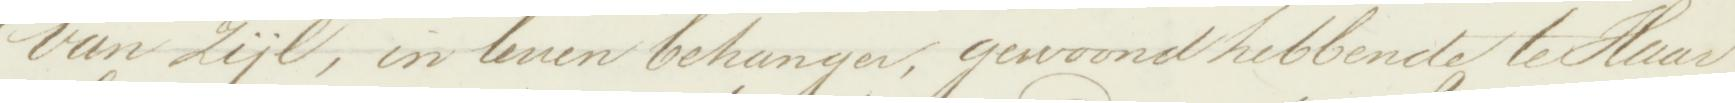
van Zijl, in leven behanger, gewoond hebbende te Haar
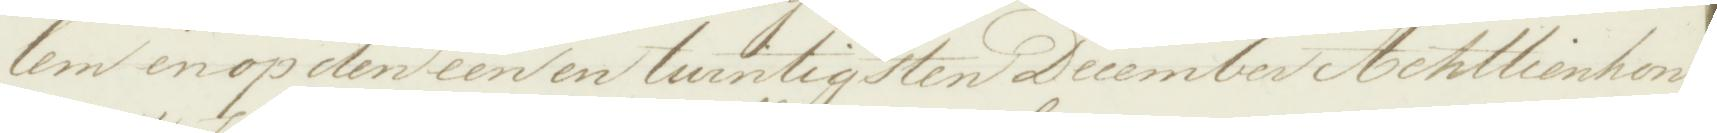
lem en op den een en twintigsten December Achttienhon
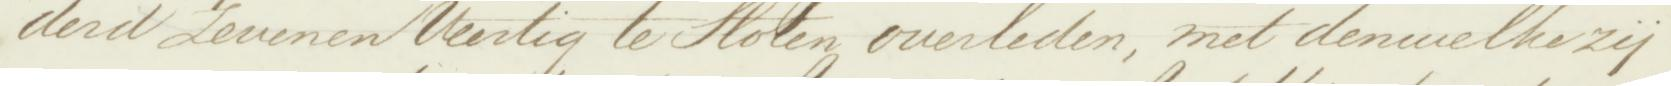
„derd Zevenen Veertig te Sloten overleden, met denwelke zij
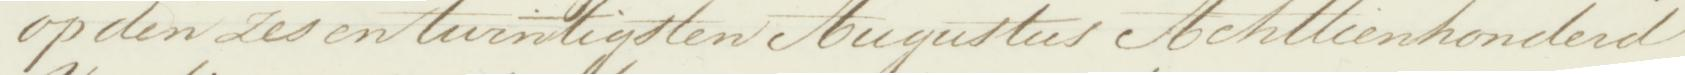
op den zes en twintigsten Augustus Achttienhonderd
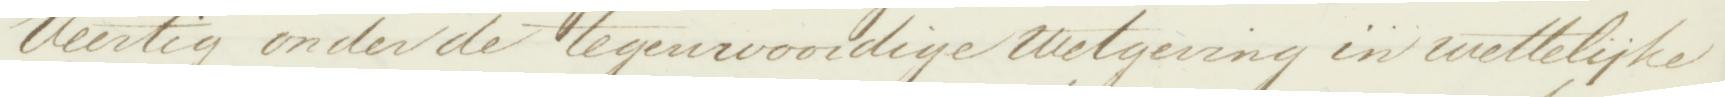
Veertig onder de tegenwoordige wetgeving in wettelijke
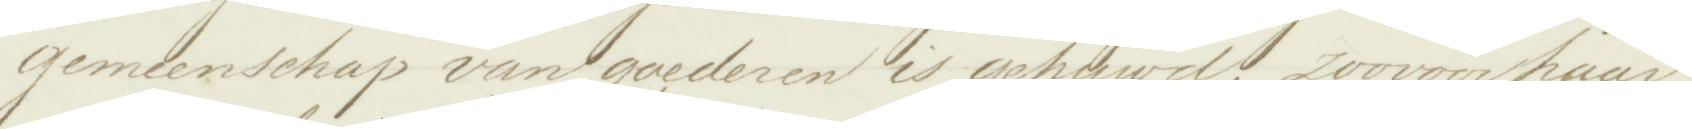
gemeenschap van goederen is gehuwd, zoo voor haar
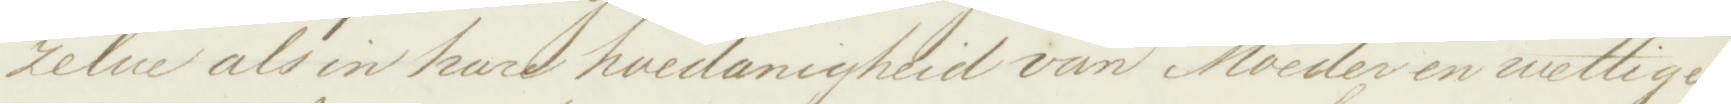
zelve als in hare hoedanigheid van Moeder en wettige
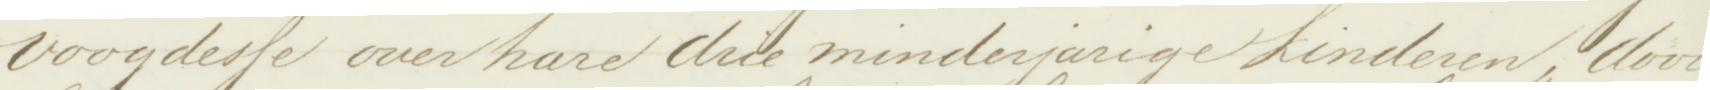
voogdesse over hare drie minderjarige kinderen door
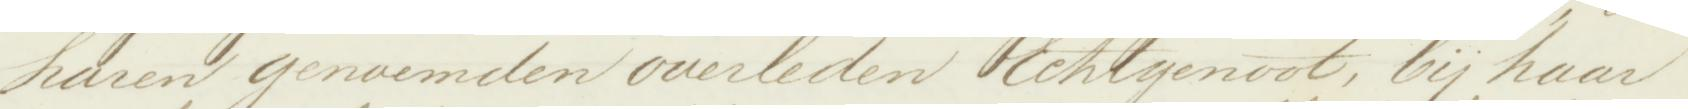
haren genoemden overleden Echtgenoot, bij haar
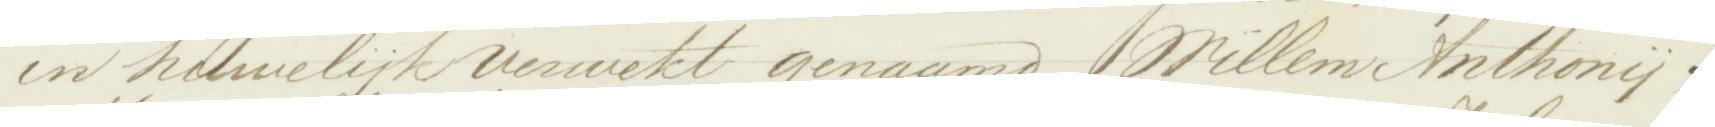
in huwelijk verwekt genaamd Willem Anthonij,
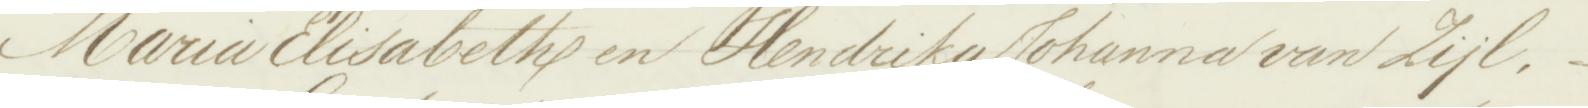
Maria Elisabeth en Hendrika Johanna van Zijl,
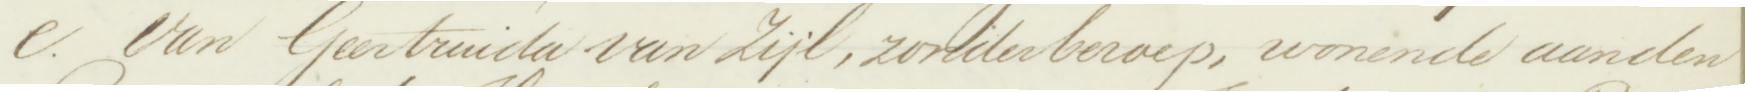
e. Van Geertruida van Zijl, zonder beroep, wonende aan den
